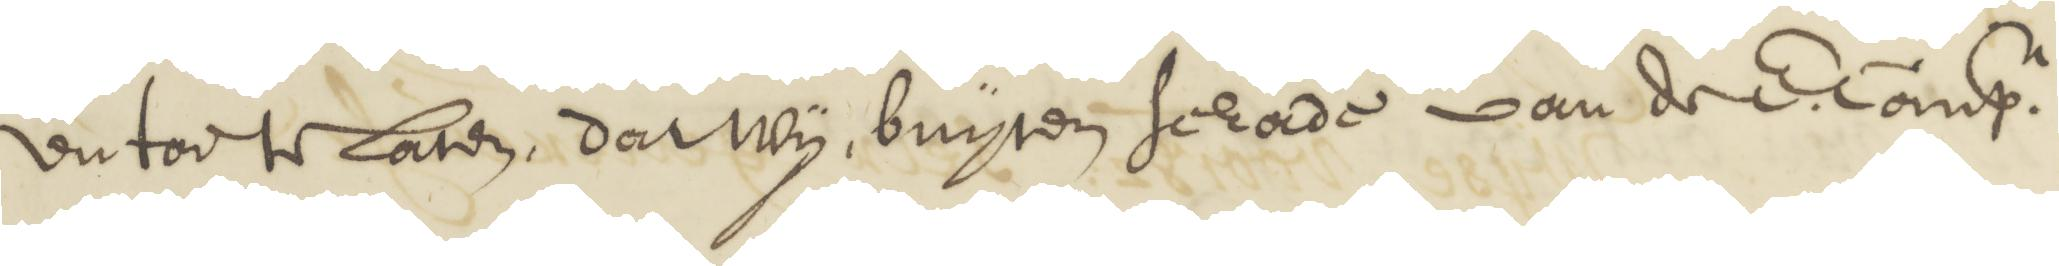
en toe te laten, dat wij, buijten schade van de E.Comp.
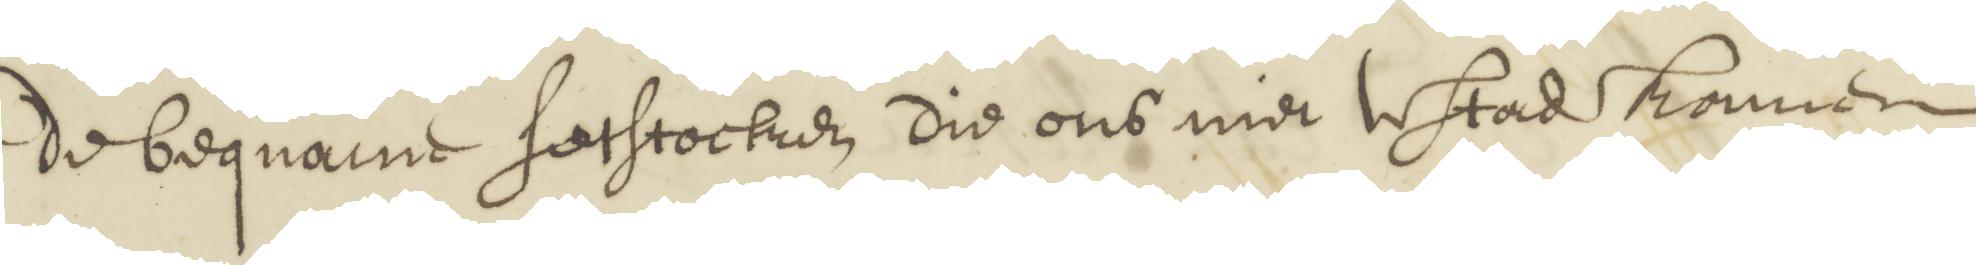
de bequame setstocken die ons niet te stade konnen
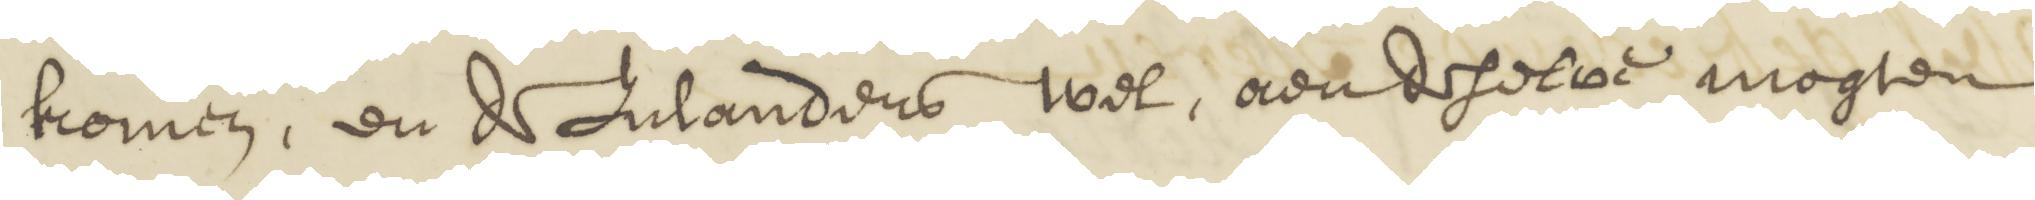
komen, en de Jnlanders wel, aen deselve mogten
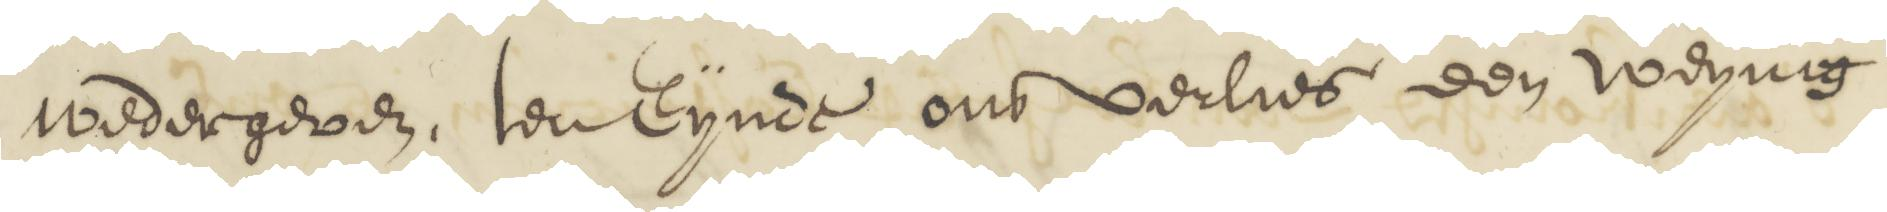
wedergeven, ten Eijnde ons verlies een weijnig
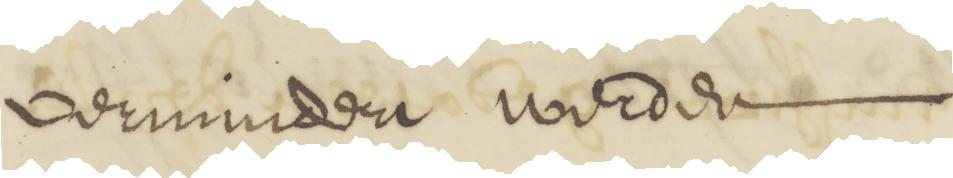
vermindert werden
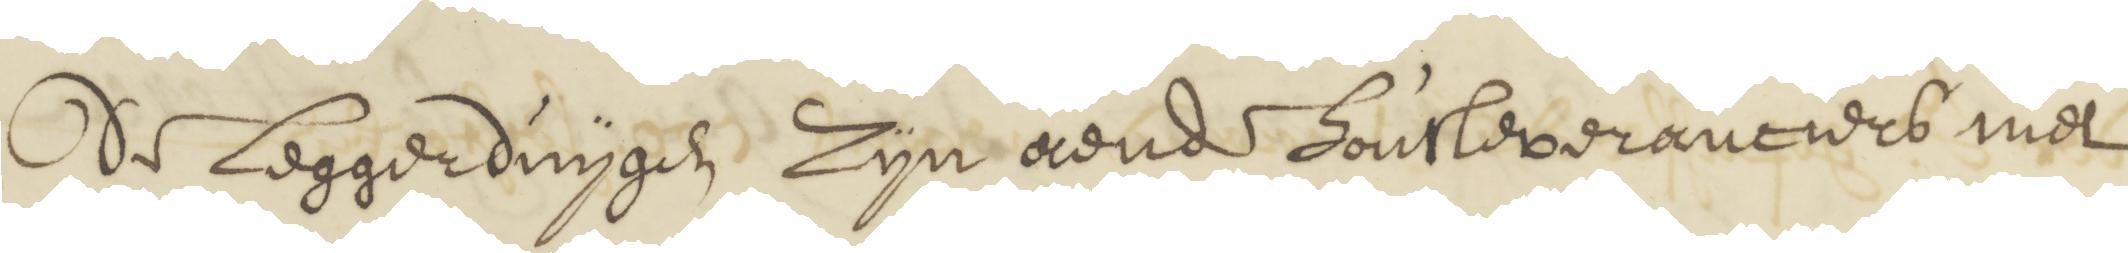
de leggerduijgen zijn aende houtleveranciers niet
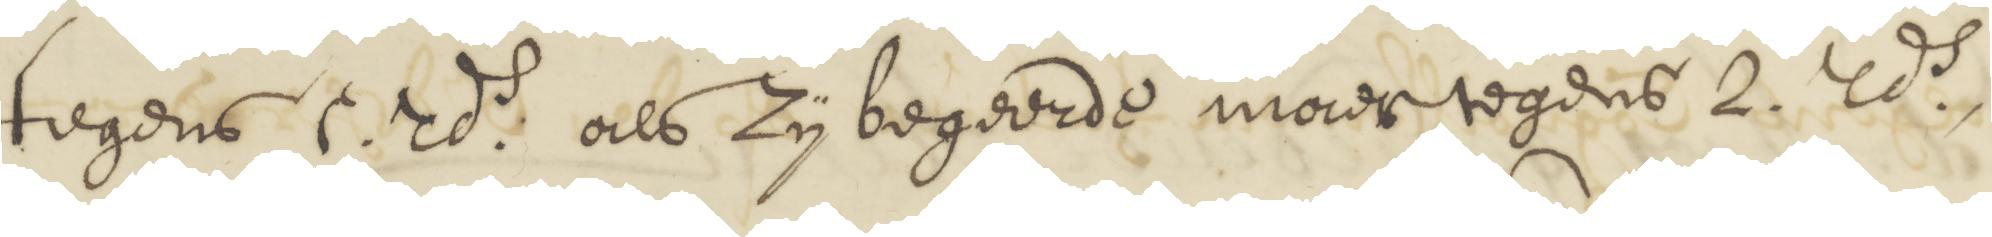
tegens 1. rd.s als zij begeerde maer tegens 2. rd.s,
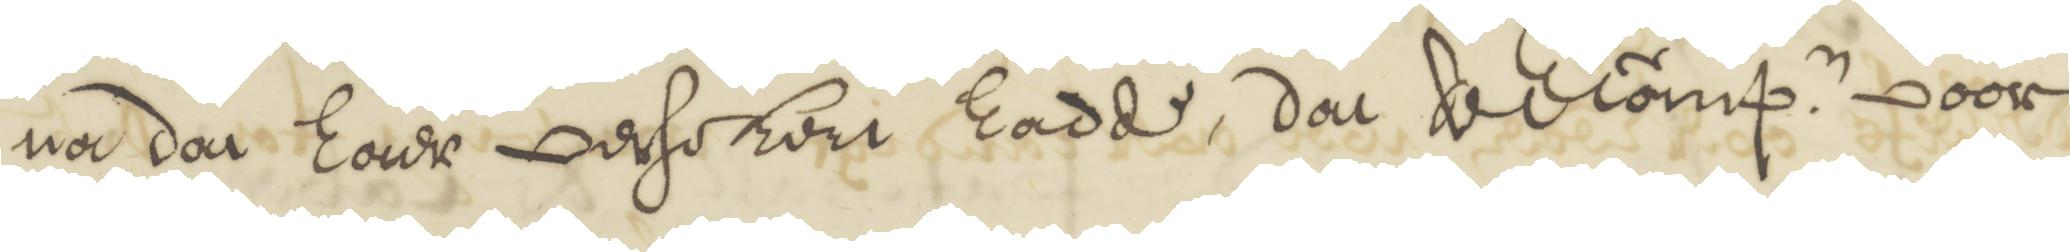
na dat haer versekert hadde, dat de EComp.n voor
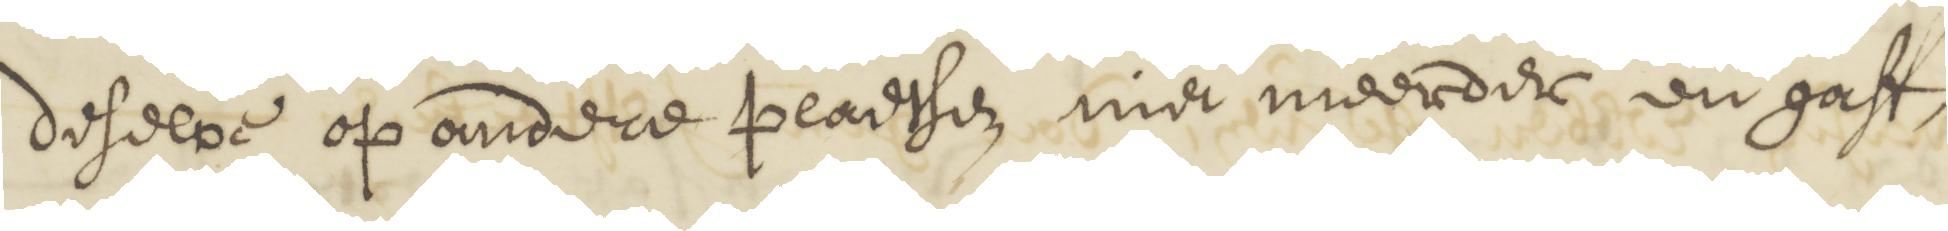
deselve op andere plaetsen niet meerder en gaff,
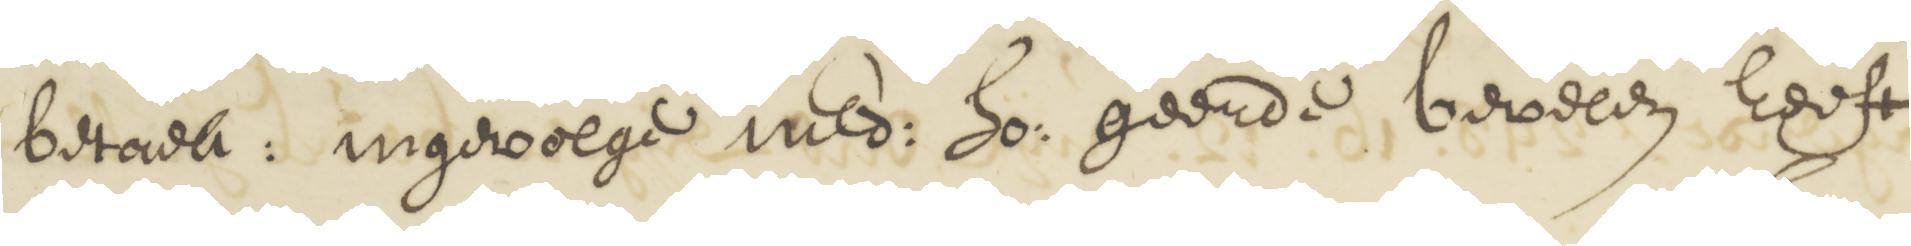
betaelt: ingevolge uEd: ho: g'eerde bevelen heeft
